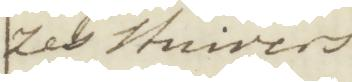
Zes stuivers
